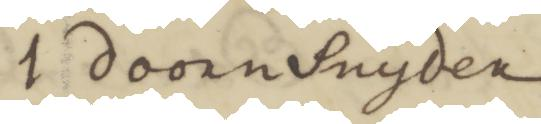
1 doornsnyder
